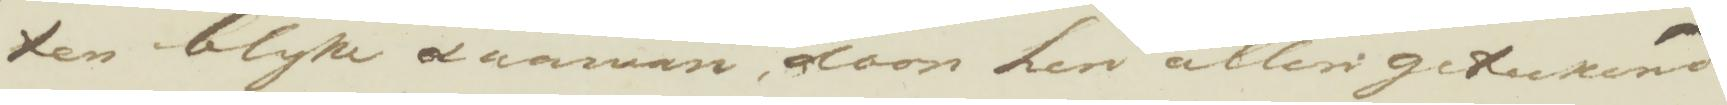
ten blyke daarvan, door hen allen geteekend
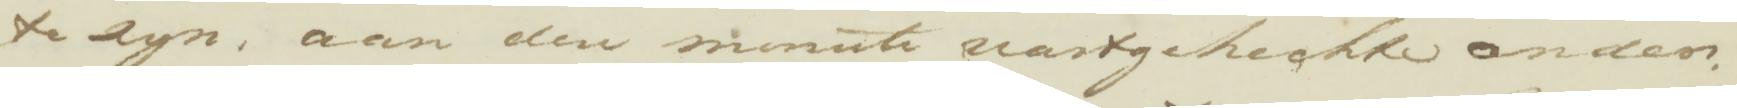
te zyn, aan den minute vastgehechte onder„
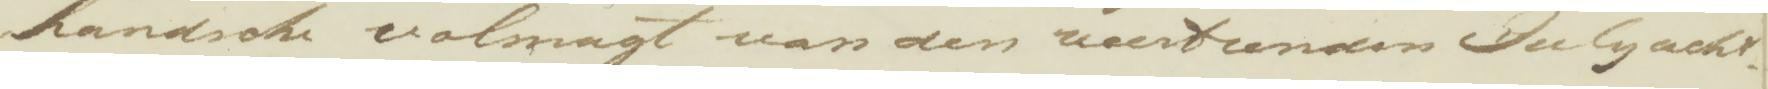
handsche volmagt van den veertienden Iuly acht„
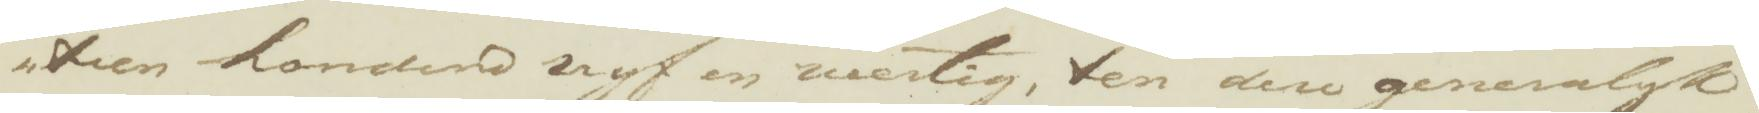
„tien honderd vyf en veertig, ten deze generalyk
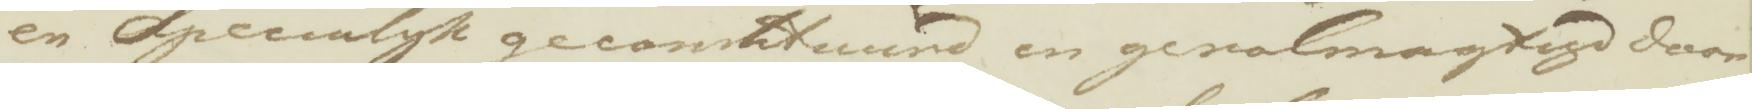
en specialyk geconstituurd en gevolmagtigd door
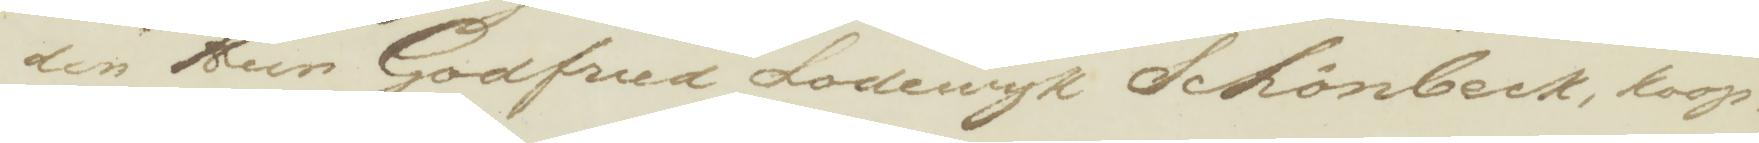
den Heer Godfried Lodewyk Schönbeck, koop
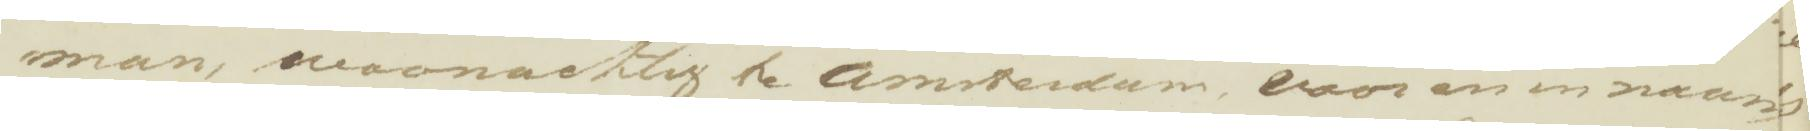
man, woonachtig te Amsterdam, voor en in naam
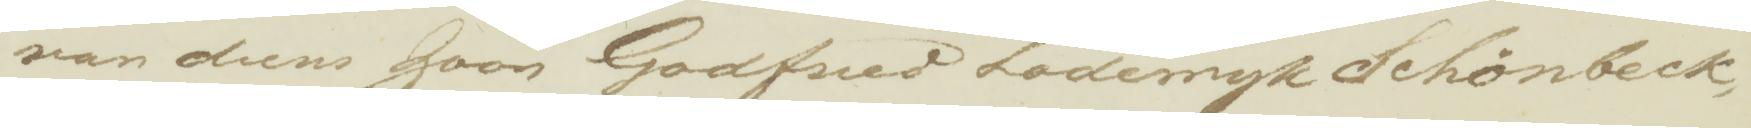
van diens Zoon Godfried Lodewyk Schönbeck,
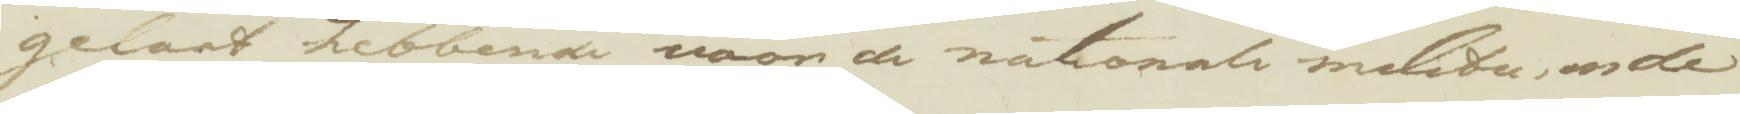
geloot hebbende voor de nationale militie, in de
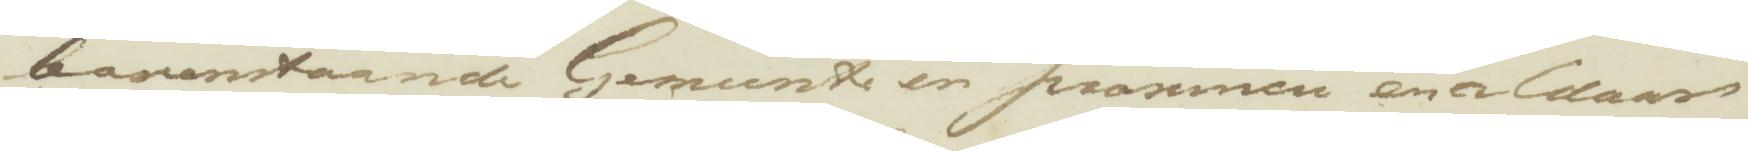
bovenstaande Gemeente en provincie en aldaar
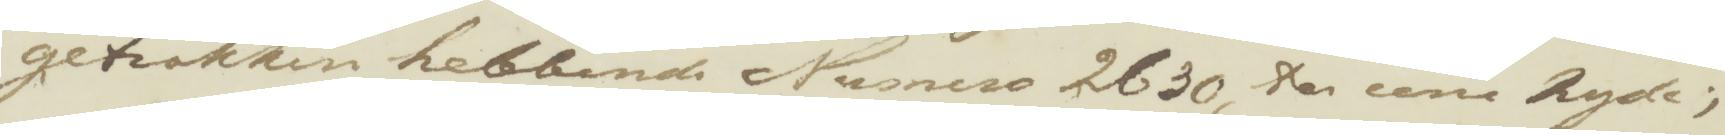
getrokken hebbend Numero 2630, ter eene zyde;
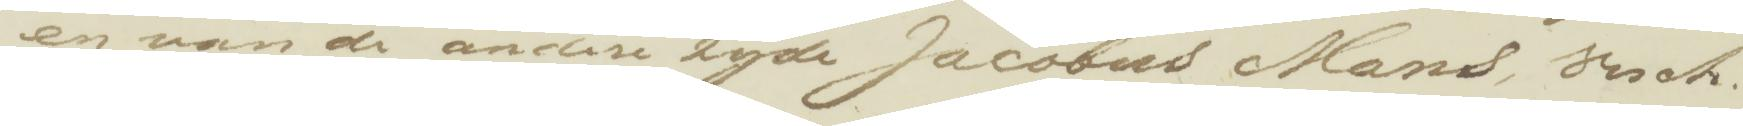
en van de andere zyde Jacobus Mans, Visch.
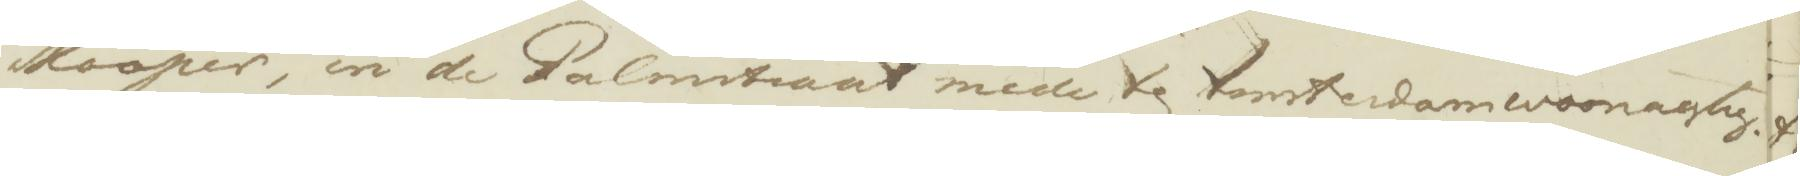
kooper, in de Palmstraat mede te Amsterdam woonagtig.
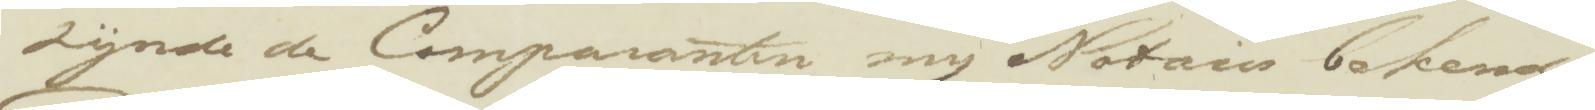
zijnde de Comparanten my Notaris bekend.
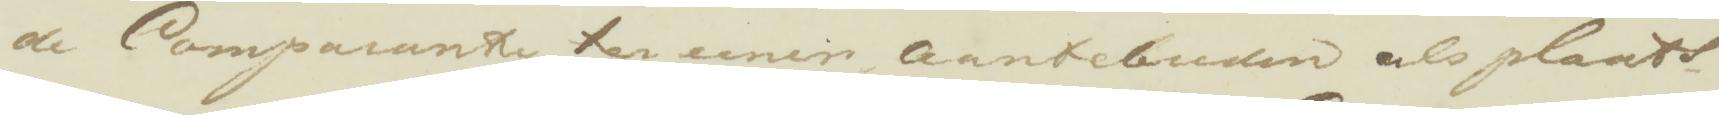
de Comparante ter eener aantebieden als plaats
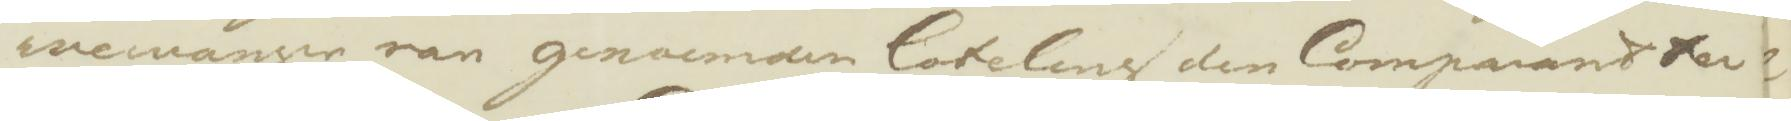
vervanger van genoemden loteling den Comparant ter
